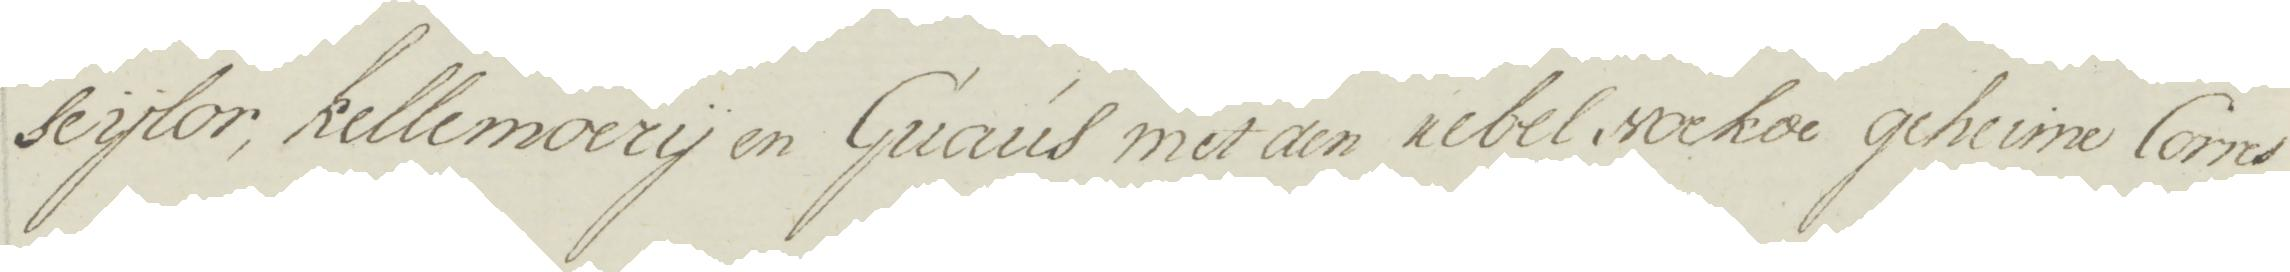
seijlor, kellemoerij en Guaus met den rebel noekoe geheime Corres
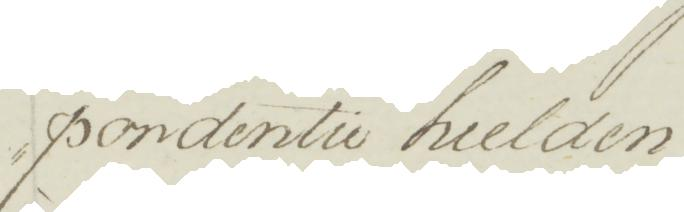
„pondentie hielden
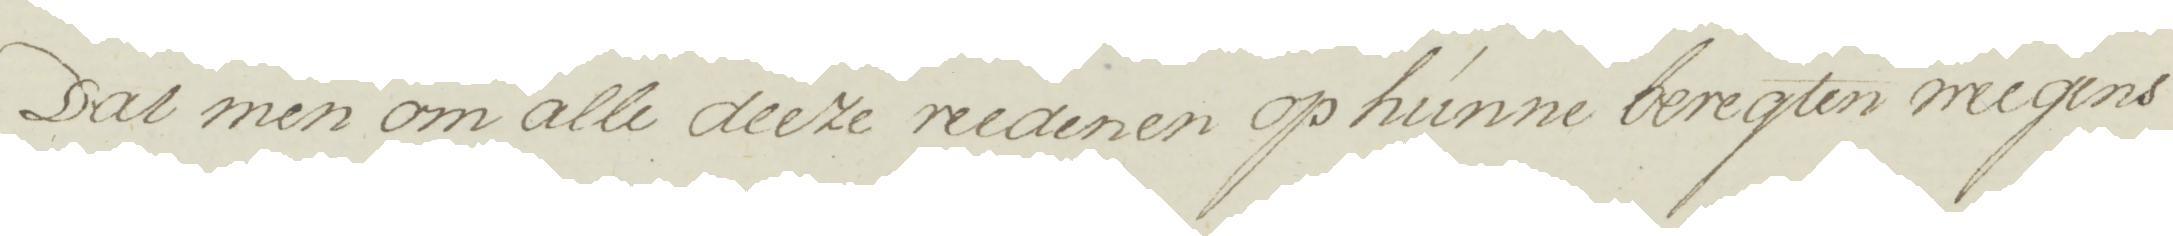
Dat men om alle deeze reedenen op hunne beregten weegens
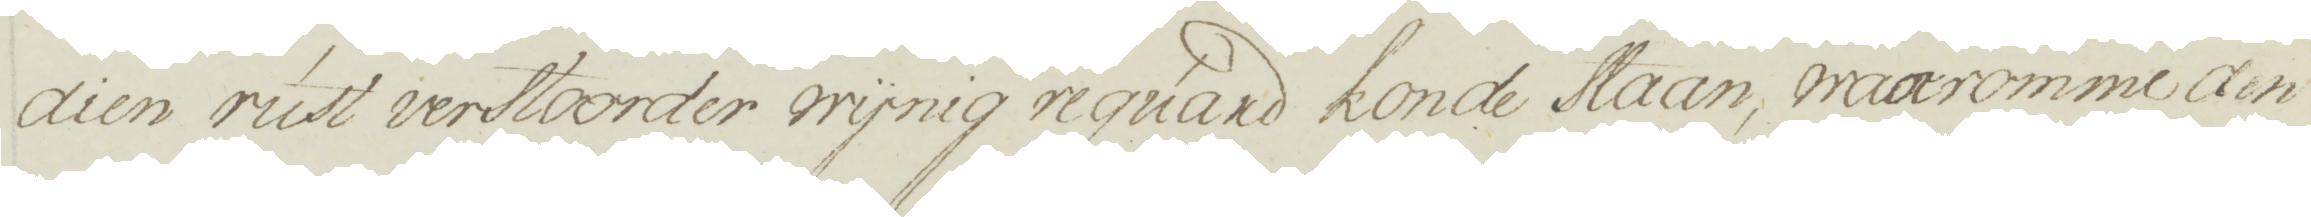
dien rust verstoorder wijnig reguard konde slaan, waaromme den
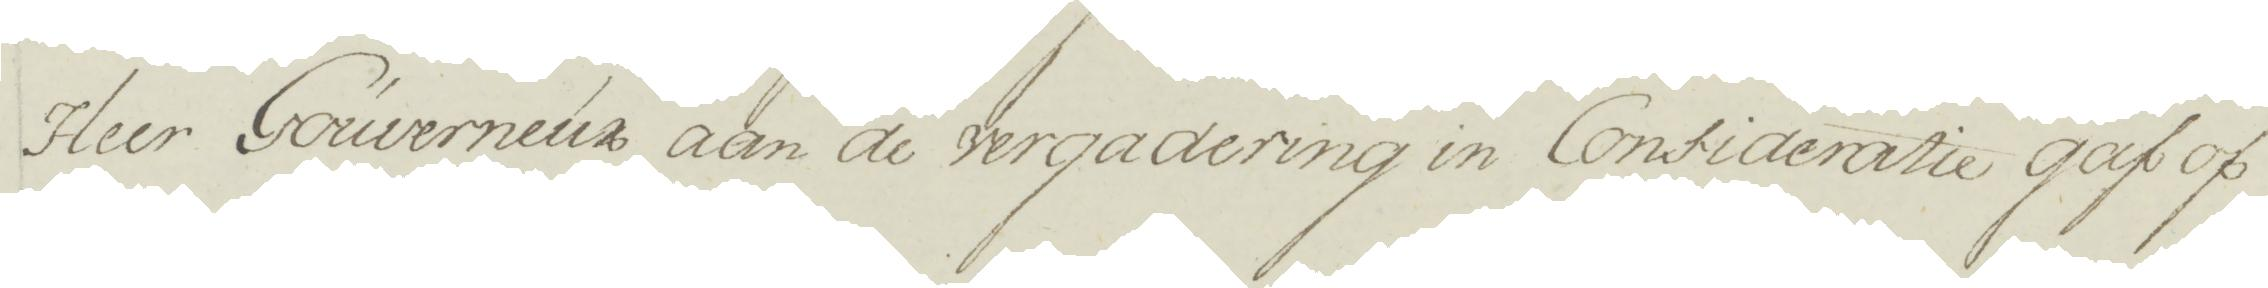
Heer Gouverneur aan de vergadering in Consideratie gaf of
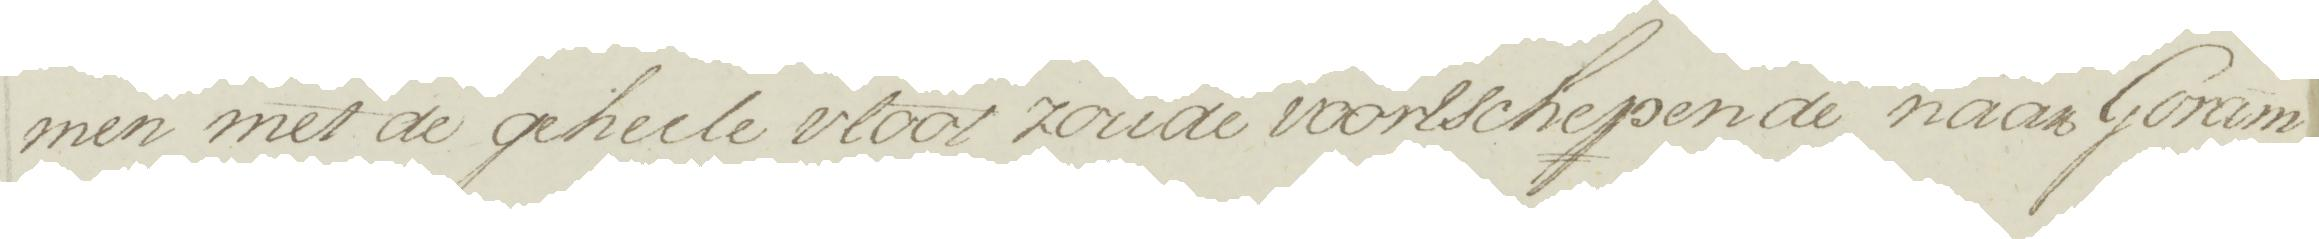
men met de geheele vloot zoude voortschepen de naar Goram
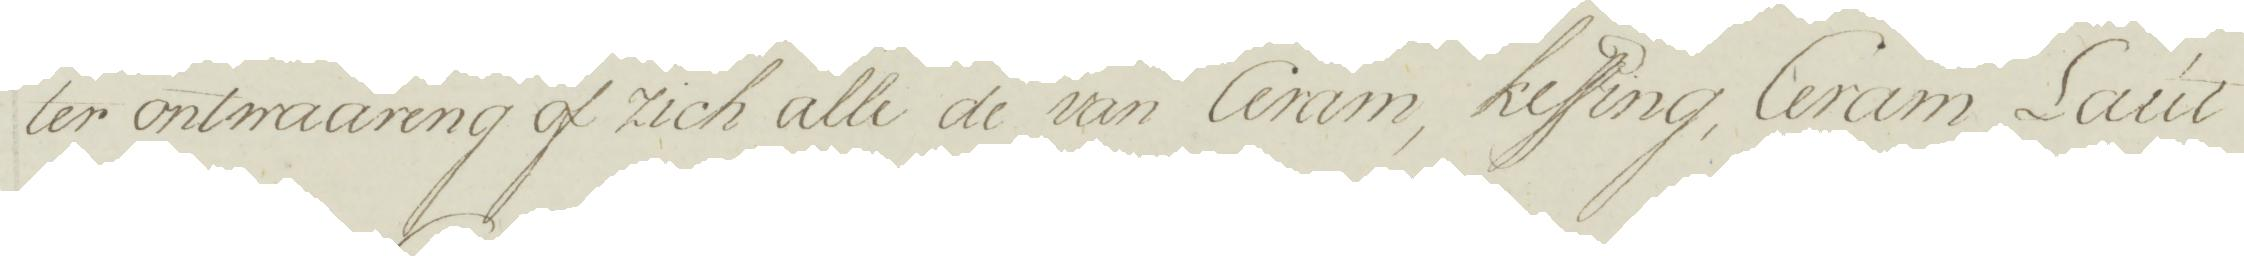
ter ontwaaring of zich alle de van Ceram, keffing, Ceram Laut
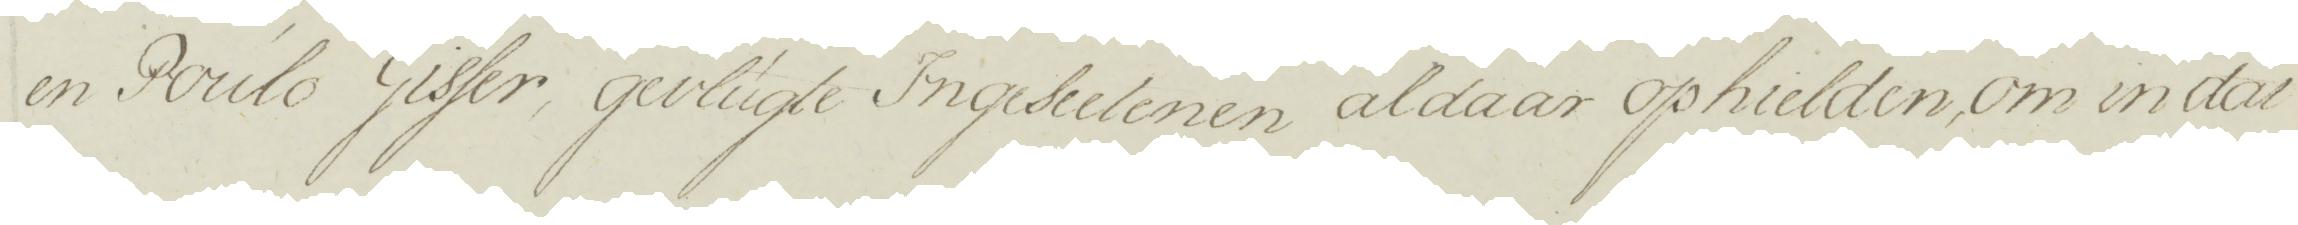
en Poulo Gisser, gevlugte Ingeseetenen aldaar ophielden, om in dat
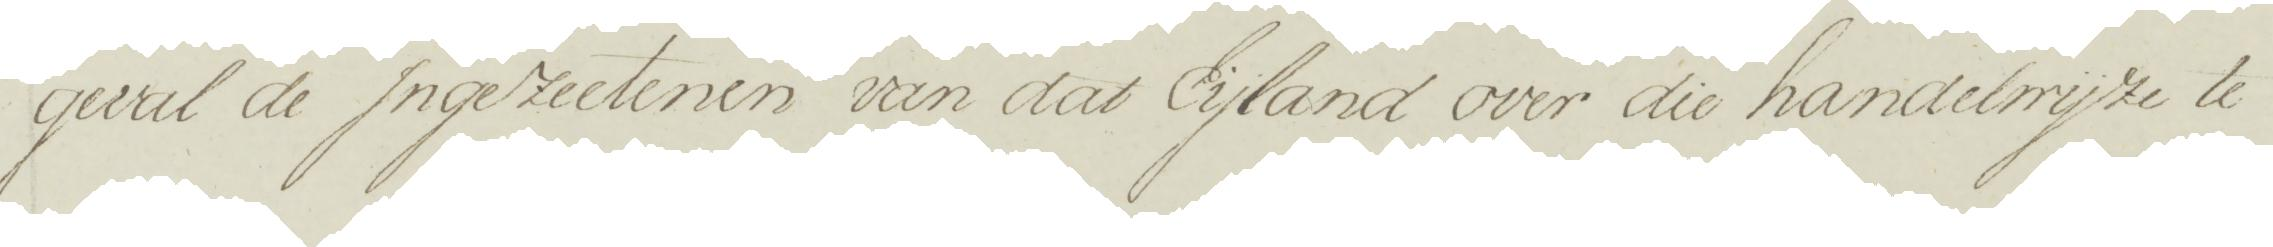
geval de Ingezeetenen van dat Eijland over die handelwijze te
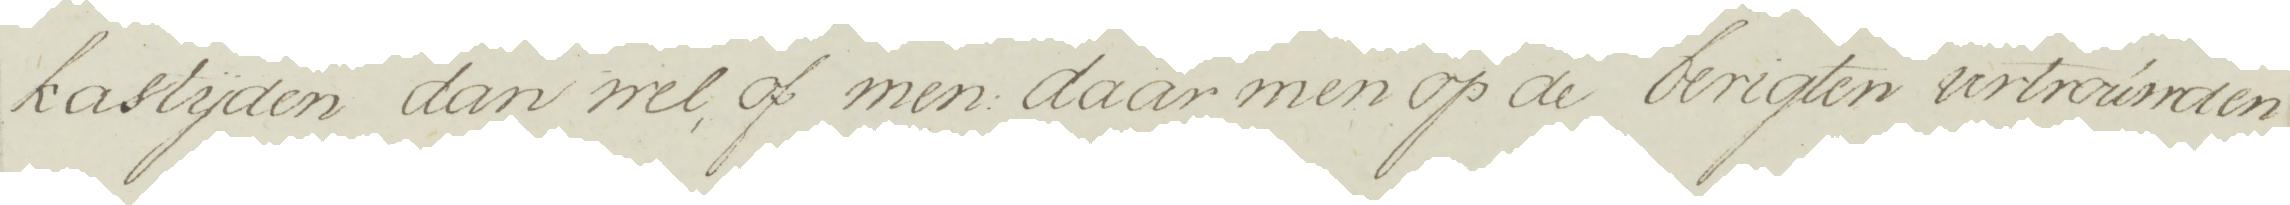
kastijden dan wel, of men daar men op de berigten vertrouwden
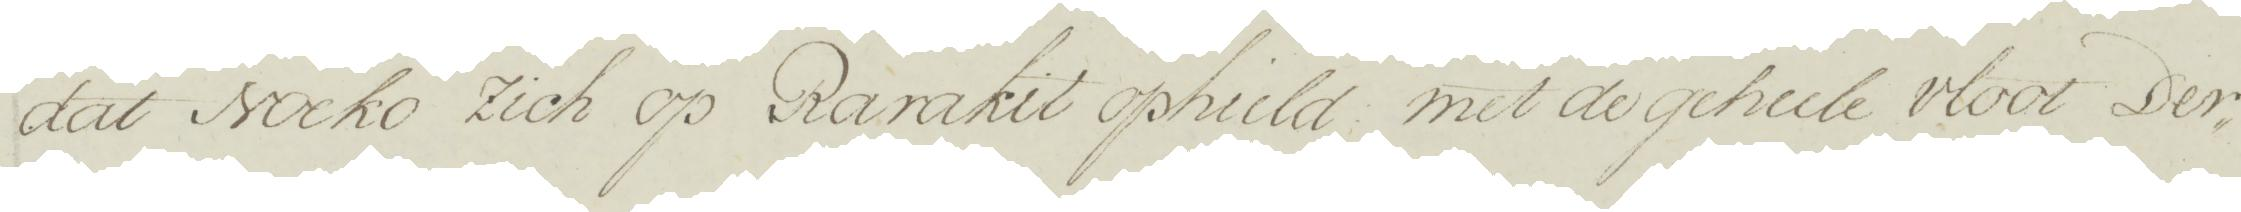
dat noeko zich op Rarakit ophield met de geheele vloot Der„
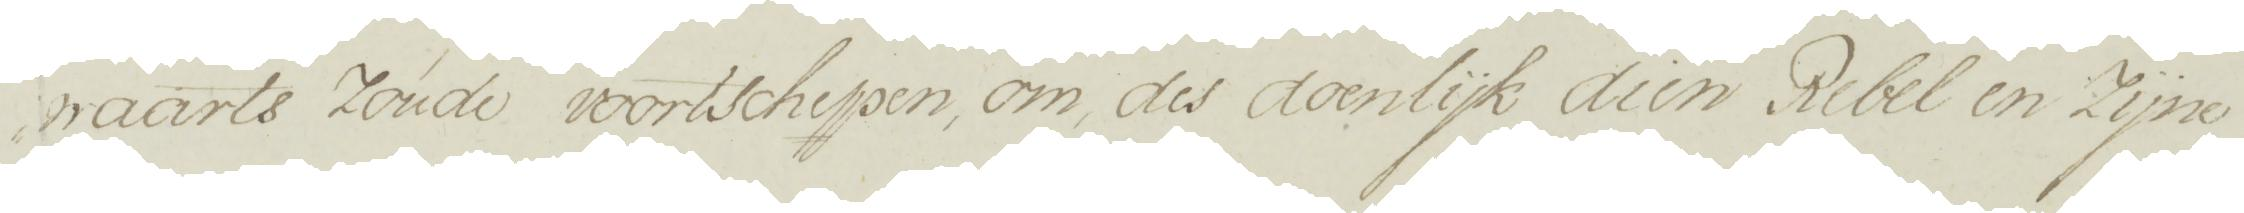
„waarts zoude voortschepen, om, des doenlijk dien Rebel en zijne
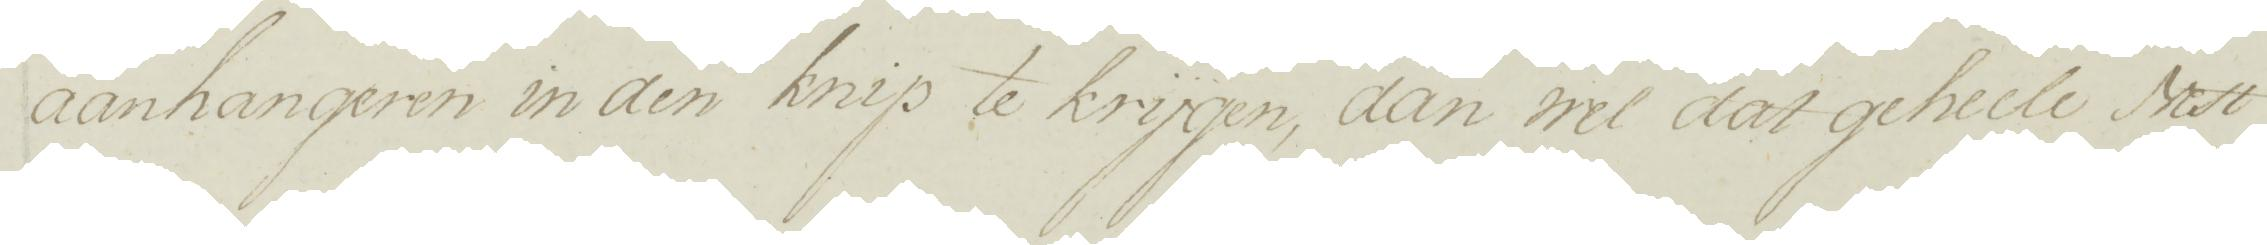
aanhangeren in den knip te krijgen, dan wel dat geheele nest
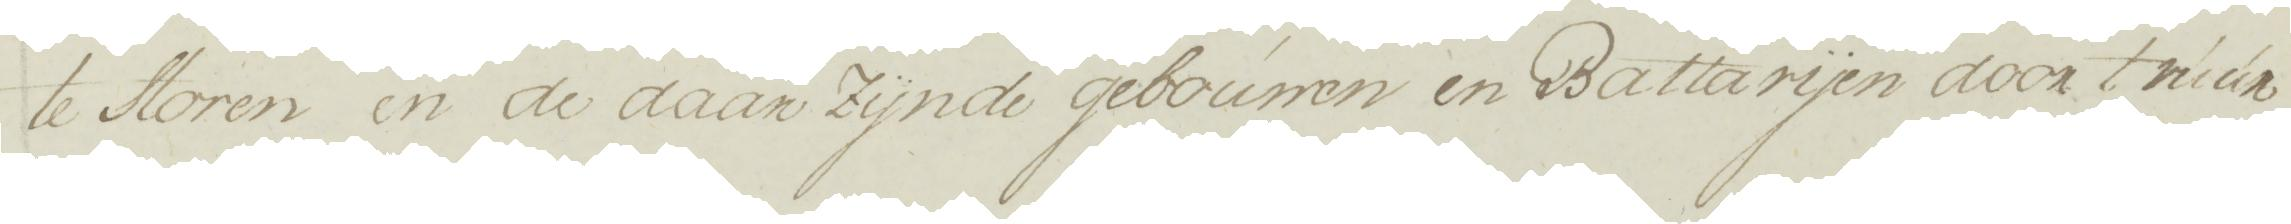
te storen en de daar zijnde gebouwen en Battarijen door t vuur
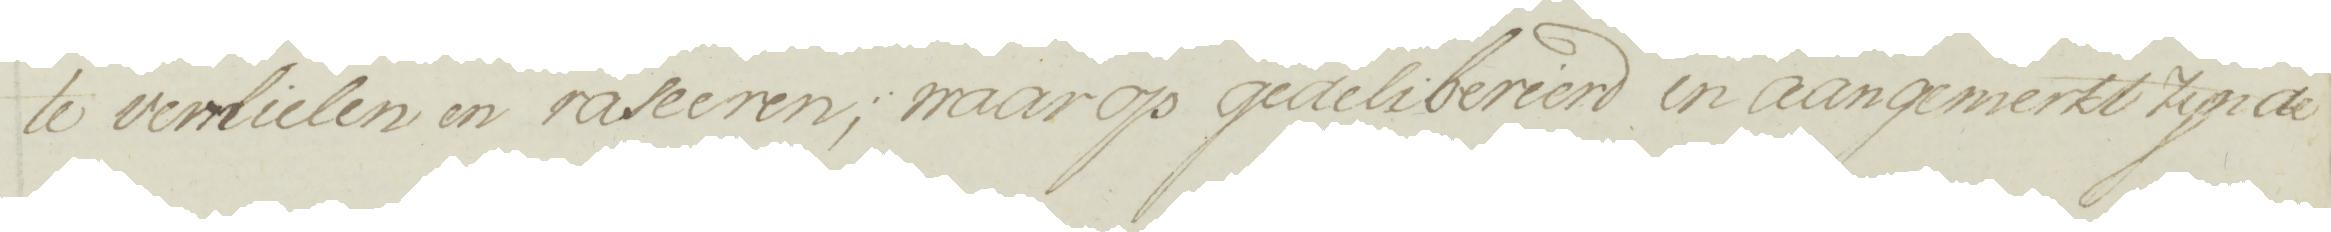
te vernielen en raseeren; waar op gedelibereerd en aangemerkt zyn de
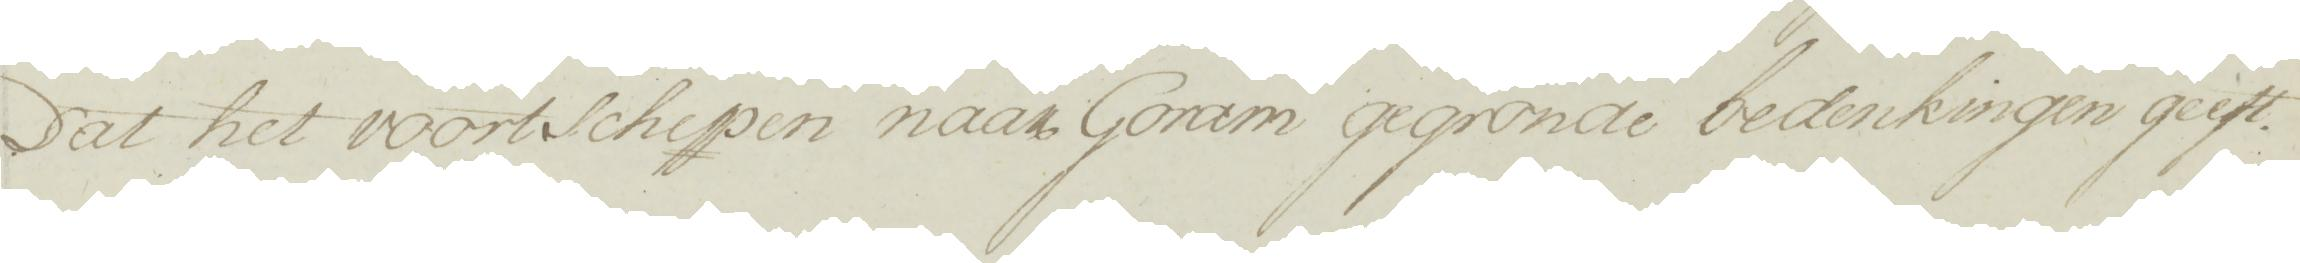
Dat het voortschepen naar Goram gegronde bedenkingen geeft
